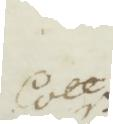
Coll r:
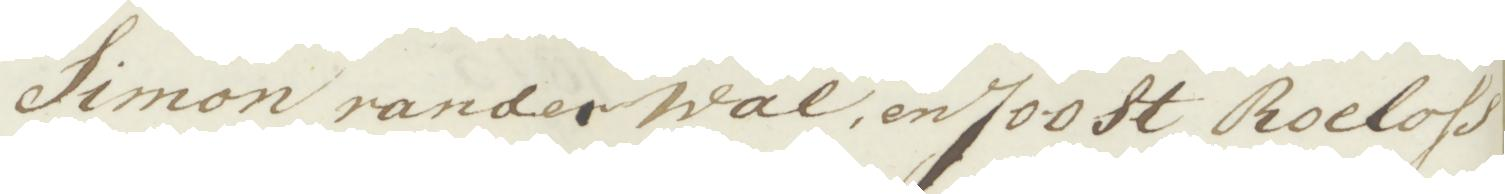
Simon vander Wal, en Joost Roelofs
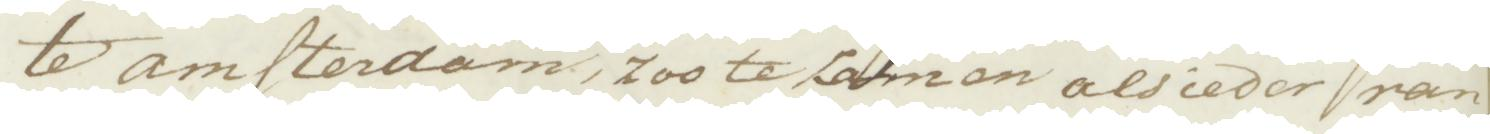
te amsterdam, zoo te zamen als ieder van
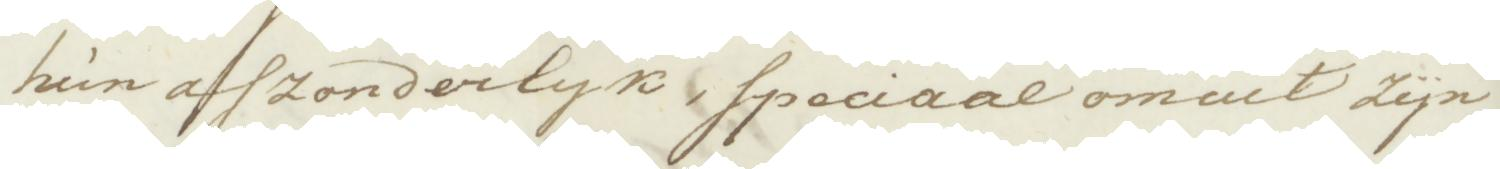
hun afzonderlyk, speciaal om uit zijn
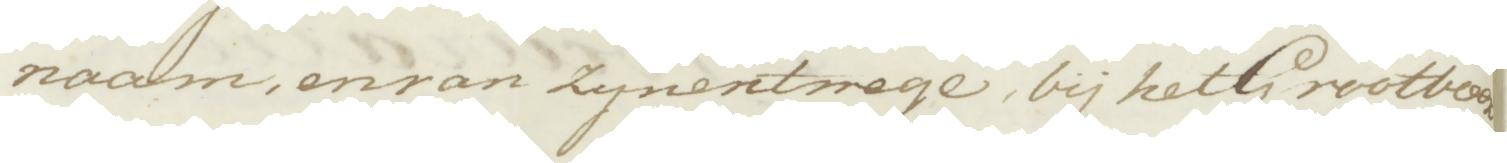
naam, en van zynentwege, bij het Grootboek
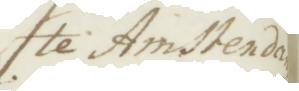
te Amsterda
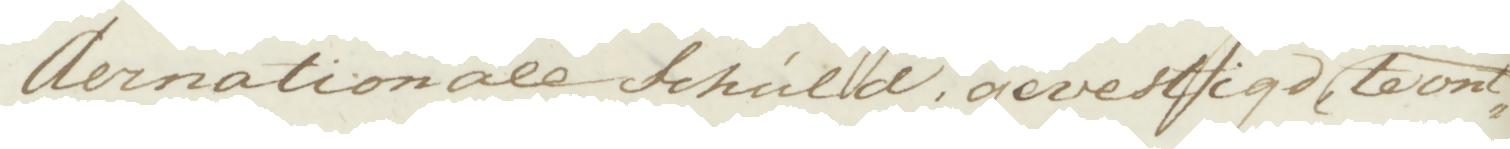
der nationale schuld, gevestigd, te ont„
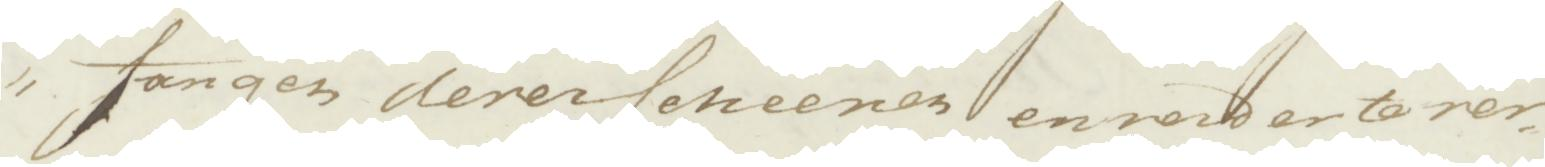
„fangen deverscheenen en verder te ver„
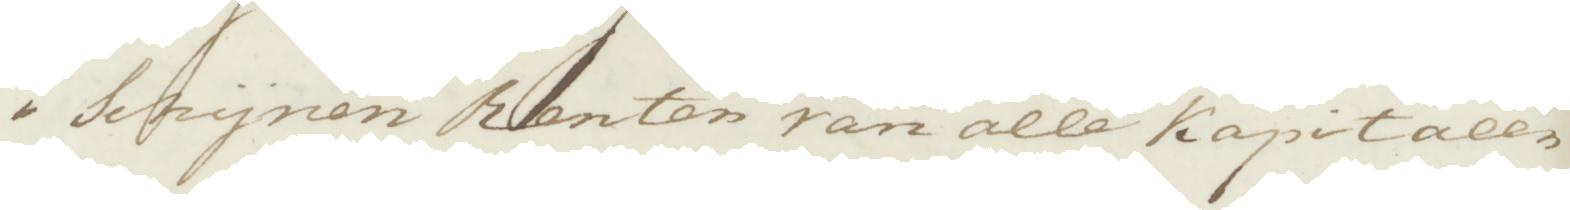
schijnen Renten van alle kapitalen
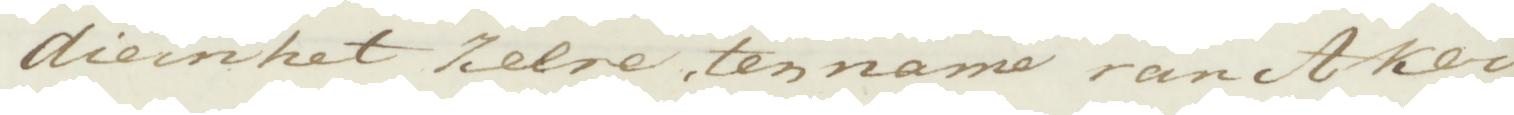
die in het zelve, ten name van Aker
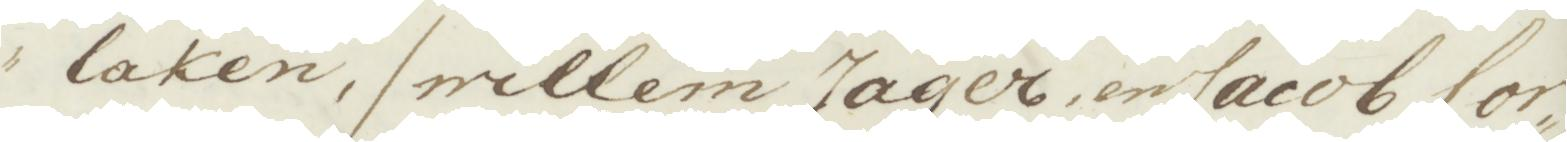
„laken, / willem Jager, en Jacob Cor„
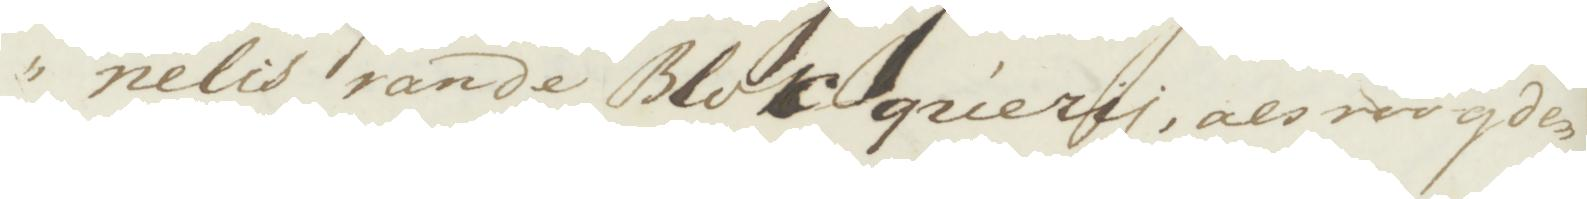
„nelis van de Blokquerij, als voogden
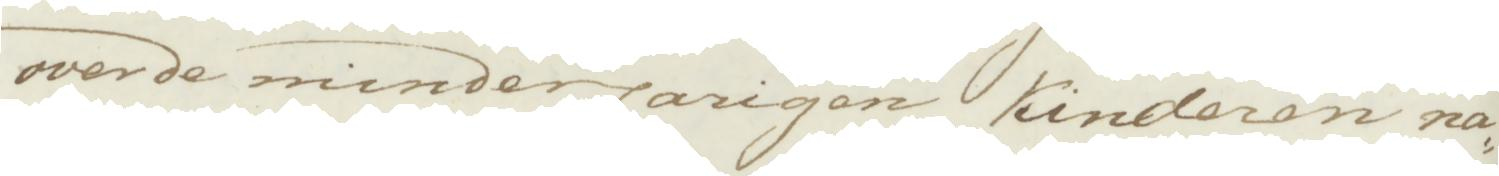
over de minderjarigen kinderen na„
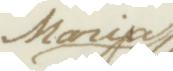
Maria
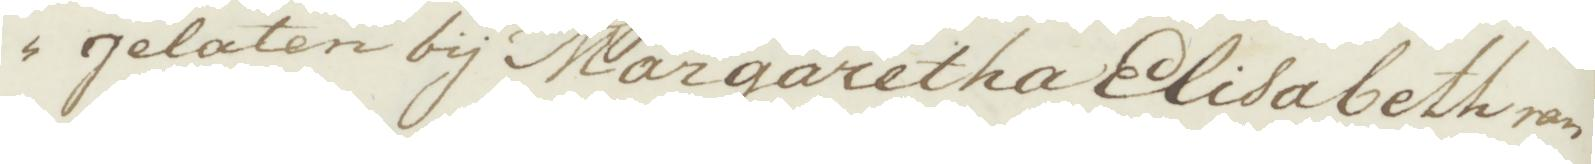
„gelaten bij Margaretha Elisabeth van
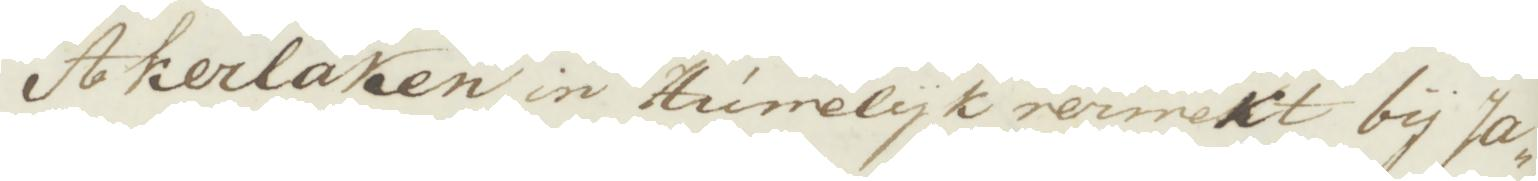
Akerlaken in Huwelijk verwekt bij Ja„
